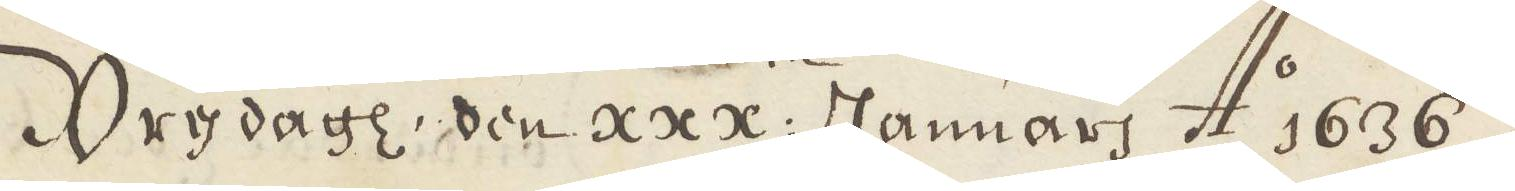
Vrijdagh, den xxx:en Januarj Ao 1636
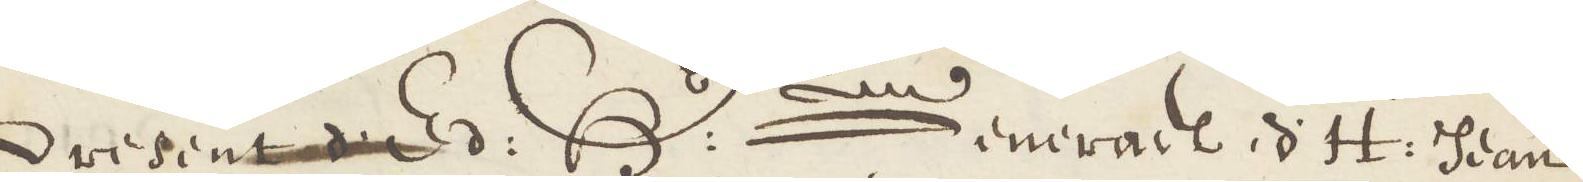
Present d' Ed: h:r Generael, d’ H:r Iean
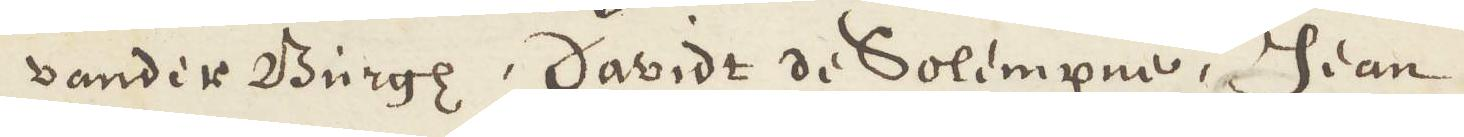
vander Burgh, Davidt de Solempne, Jean
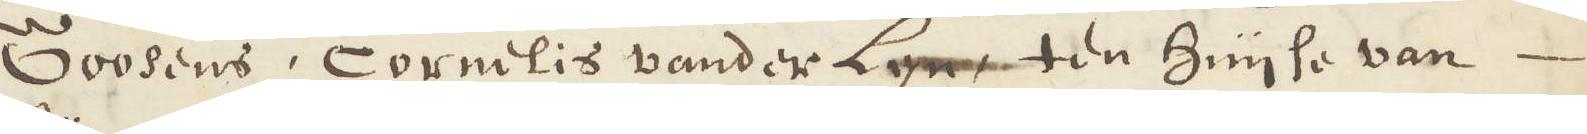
Goosens, Cornelis vander Lyn, ten huijse van —
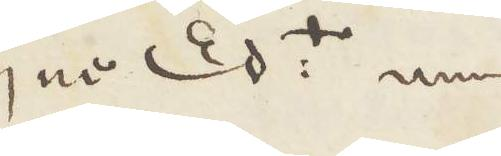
sijne Ed:t
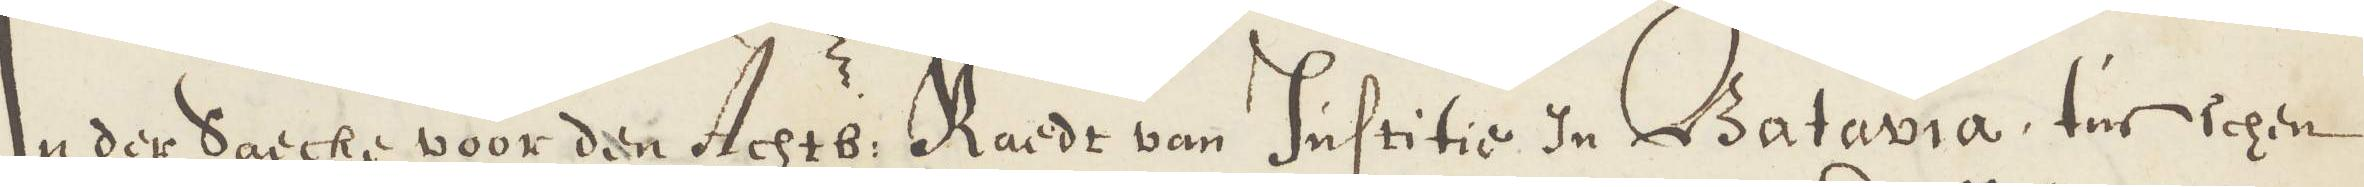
Jn der saecke voor den Achtb: Raedt van Iustitie In Batavia, tusschen
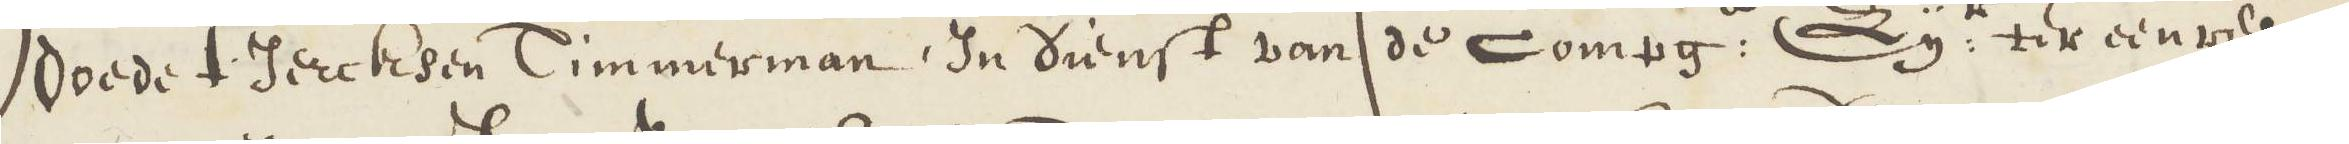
doede t' Iercksen Timmerman, In dienst van de Compg:e Eij:r ter eenre –
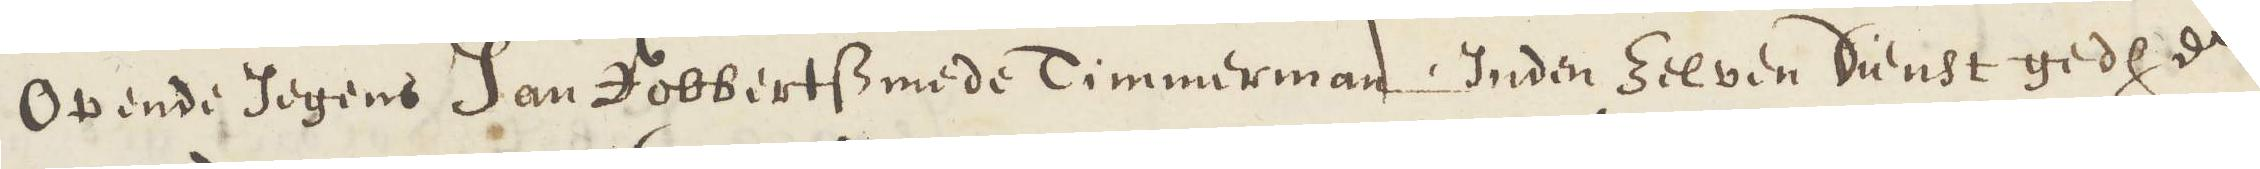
op ende Iegens Ian Robbertsz mede Timmerman, Inden selven dienst gedhe
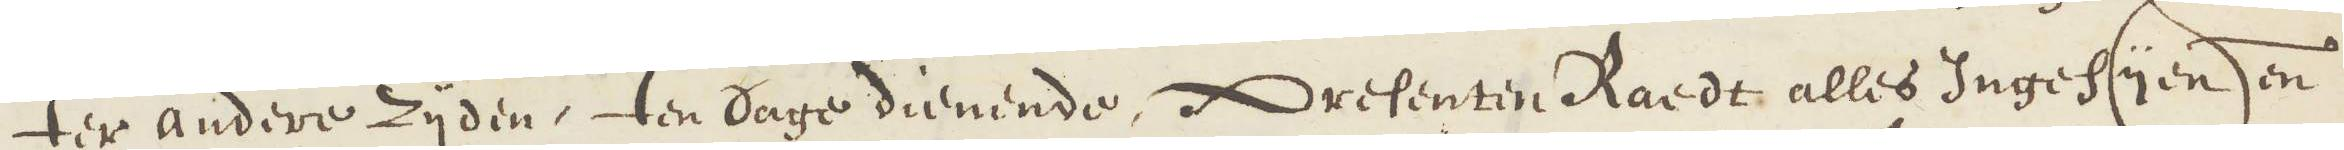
ter andere zijden, ten dage dienende, presenten Raedt alles Ingesijen ende
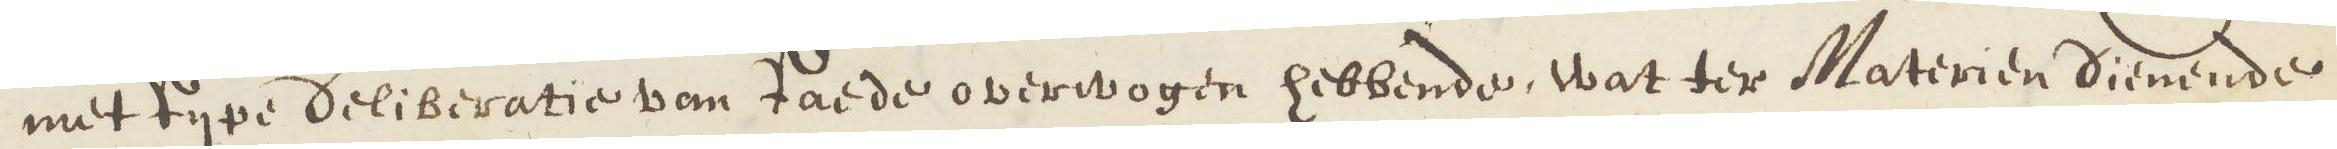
met Rype deliberatie van Raede overwogen hebbende, wat ter Materien dienende
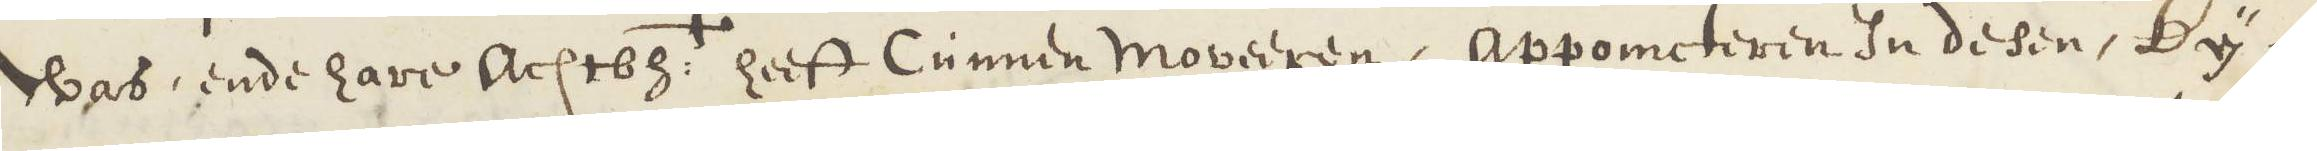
was, ende hare Achtbh:t heeft Cunnen moveeren, appoincteren In desen, bij –
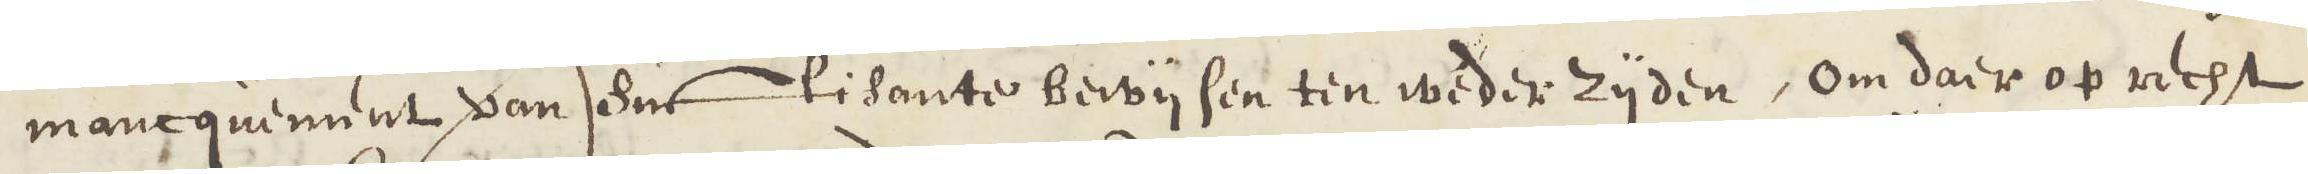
mancquement van suffisante bewijsen ten weder zijden, om daer op recht
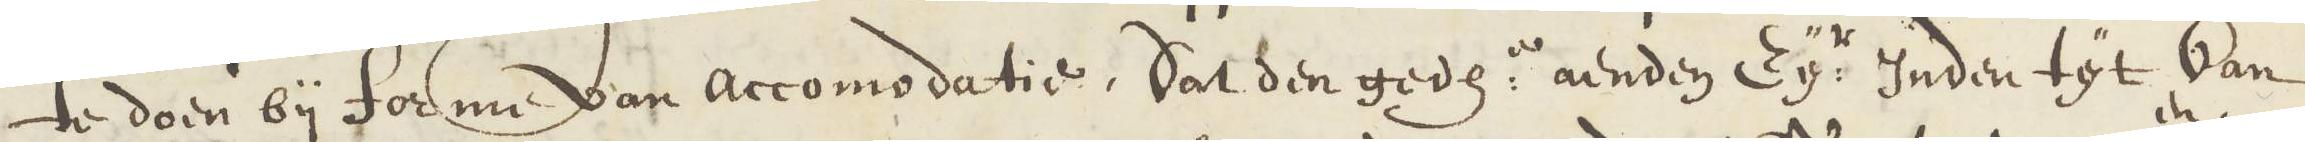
te doen bij forme van accomodatie, dat den gedh:e aenden Eij:r Inden tijt van
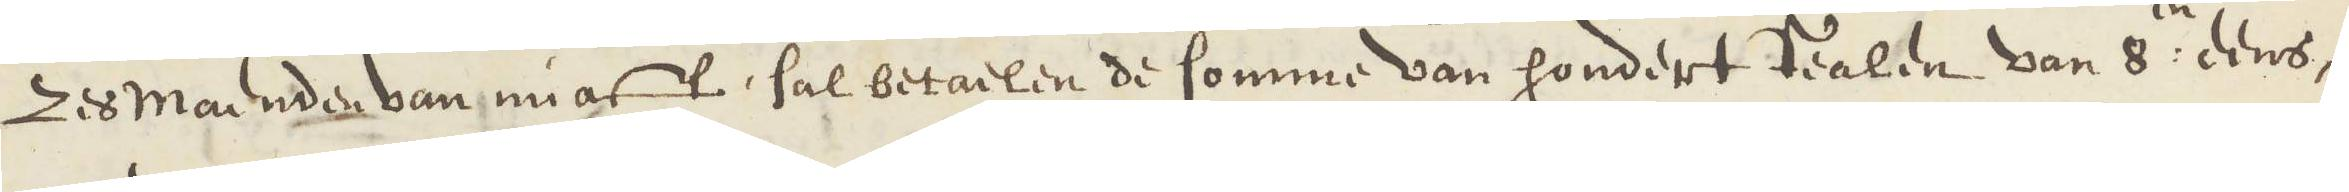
zes maenden van nu aff, sal betaelen de somme van hondert Realen van 8:en eens,
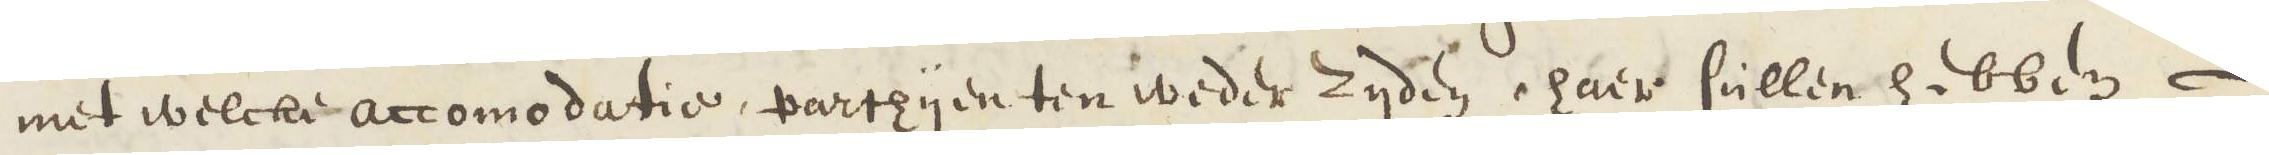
met welcke accomodatie, parthijen ten weder zijden, haer sullen hebben —
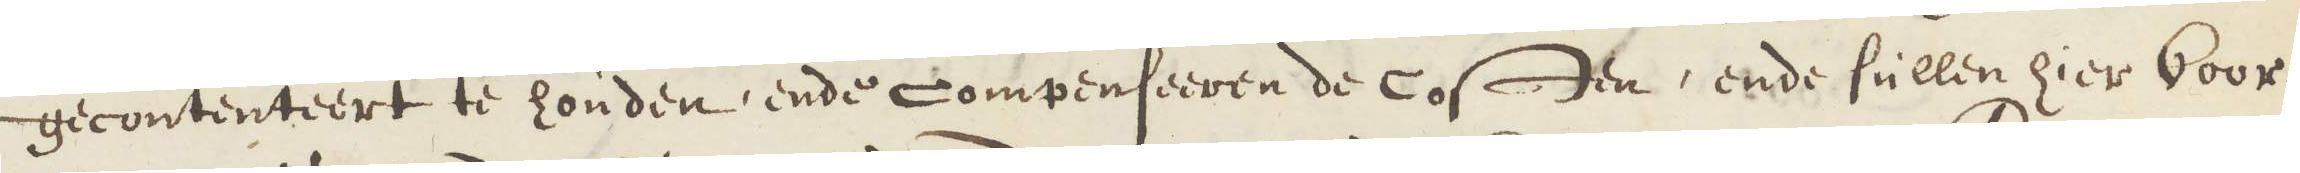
gecontenteert te houden ende compenseeren de costen, ende sullen hier voor
